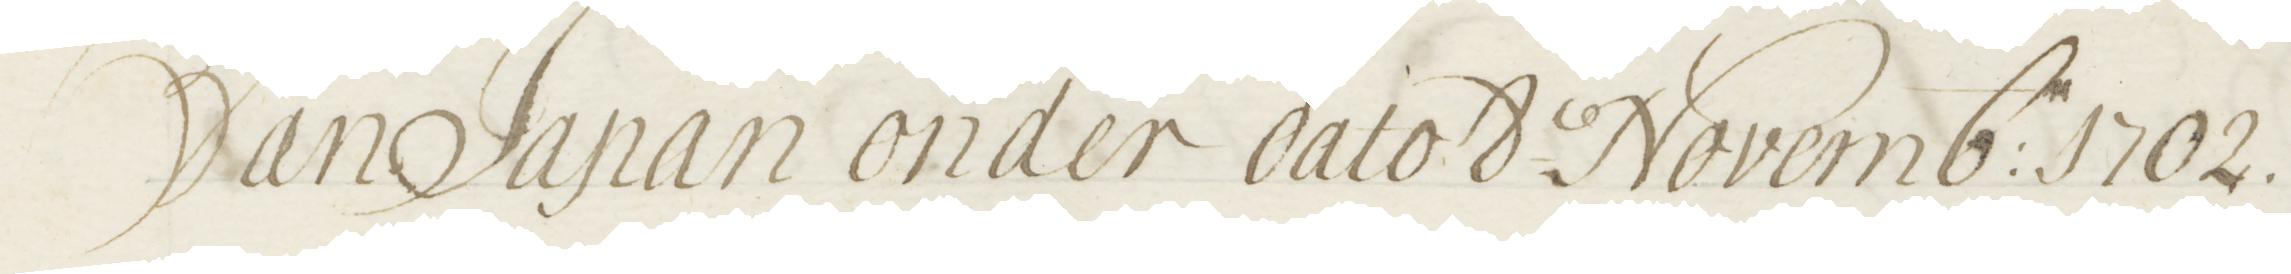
Van Japan onder dato 8e Novemb:r 1702.
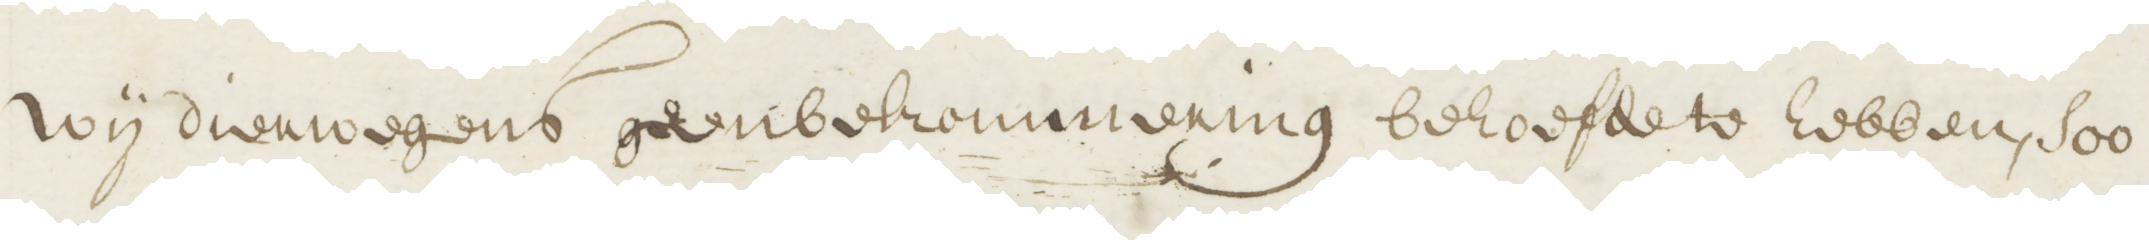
wij dierwegens geenbekommering behoefde te hebben, soo
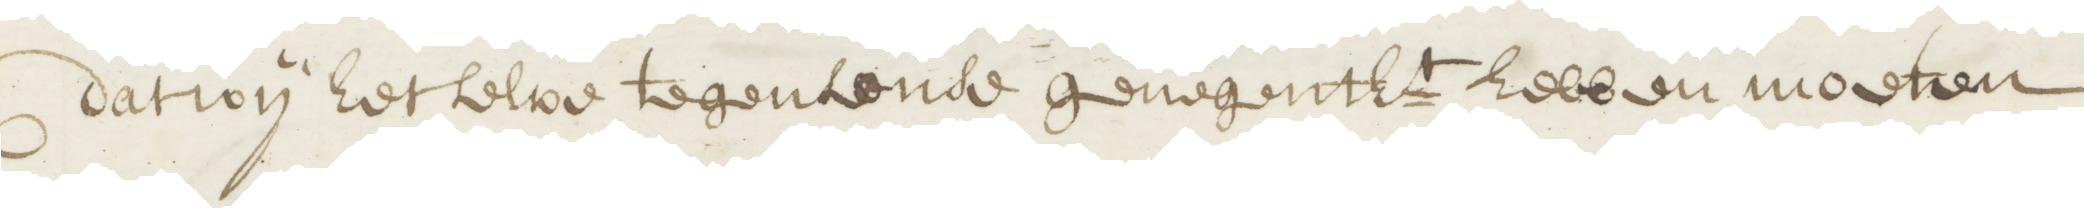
dat wij het selve tegens onse genegenth=t hebben moeten
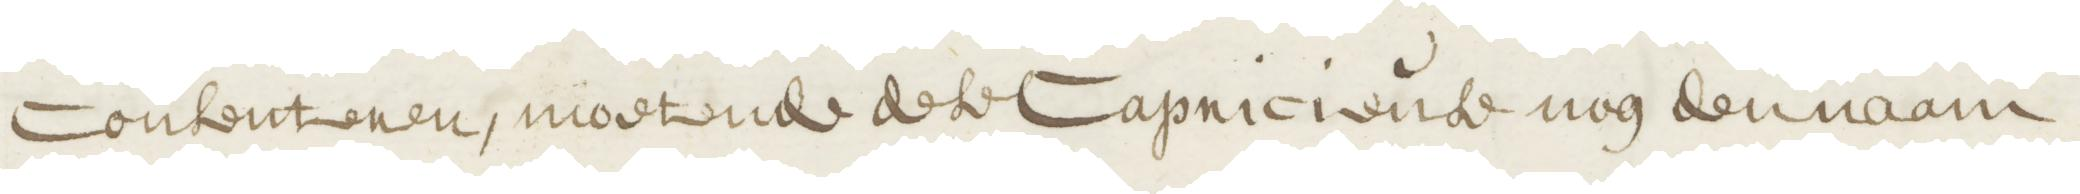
consenteren, moetende dese Capricieuse nog den naam
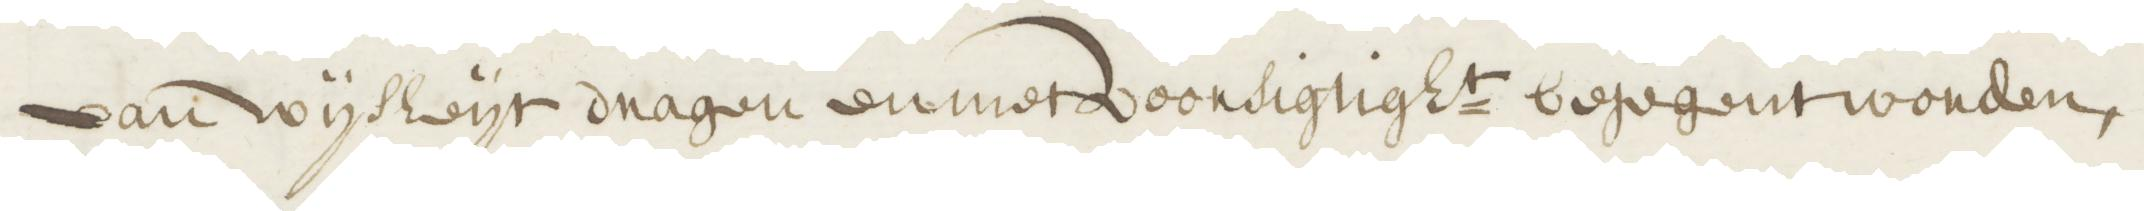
van wijsheijt dragen en met voorsigtigh=t bejegent worden,
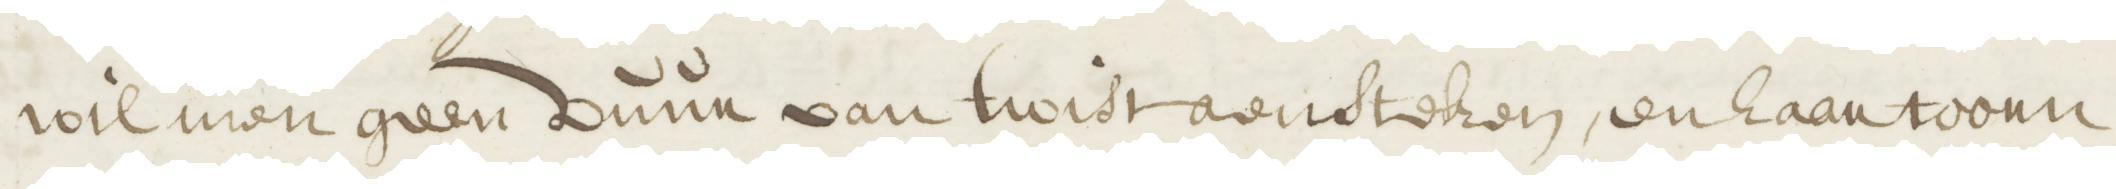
wil men geen vuur van twist aensteken, en haar toorn
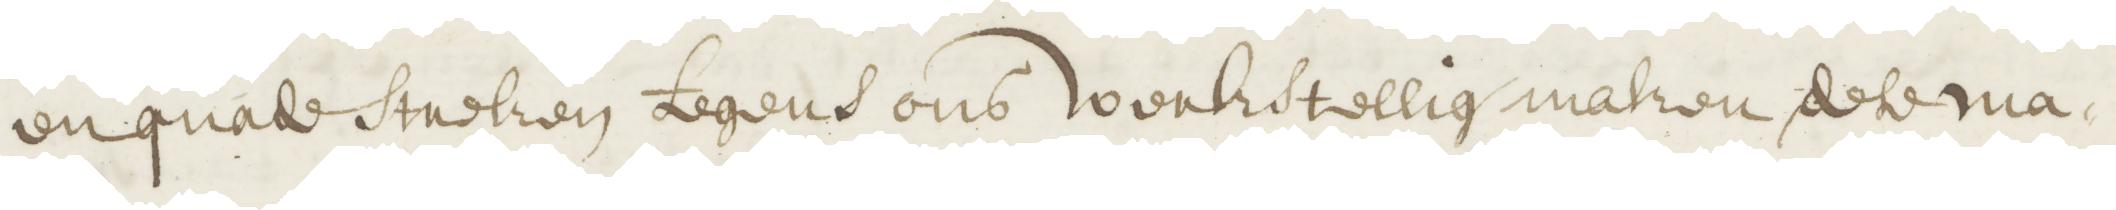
en quade streken tegens ons werkstellig maken, dese ma„
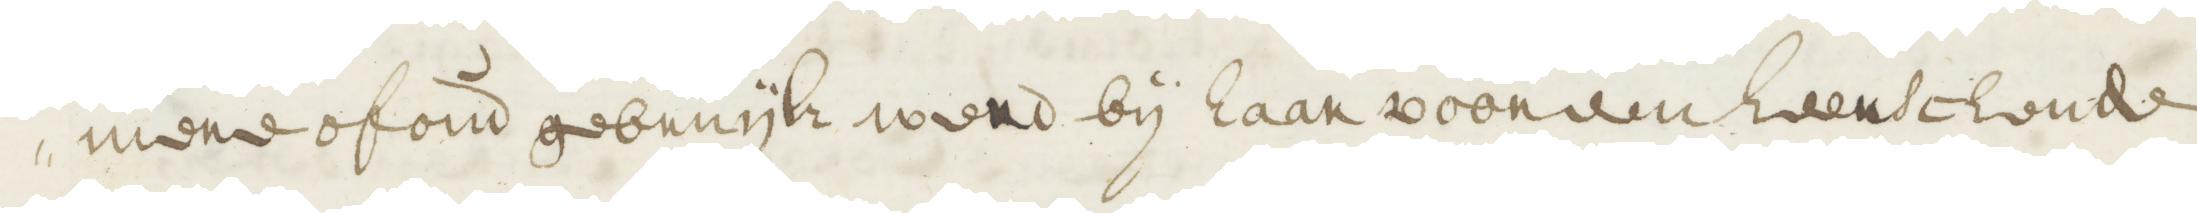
„niere of oud gebruijk werd bij haar voor een heerschende
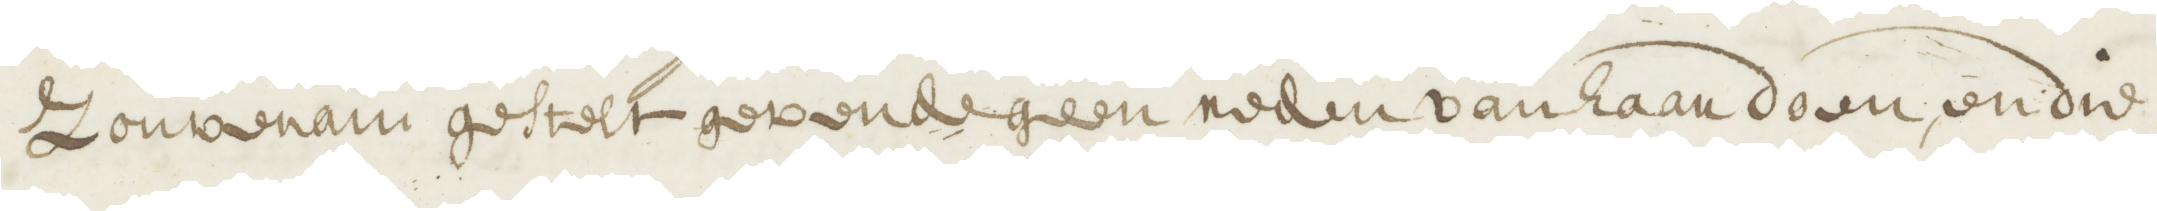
Zouverain gestelt gevende geen reden van haar doen en die
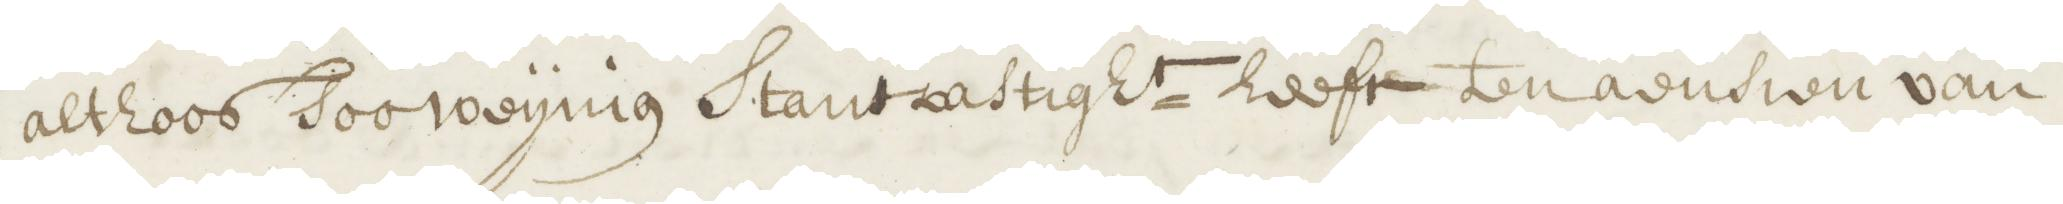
althoos soo weijnig stantvastigh=t heeft ten aensien van
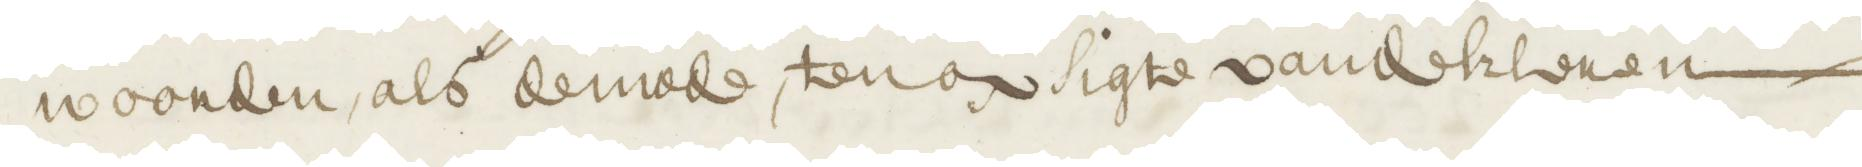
woorden, als demede, ten op sigte vandekleren
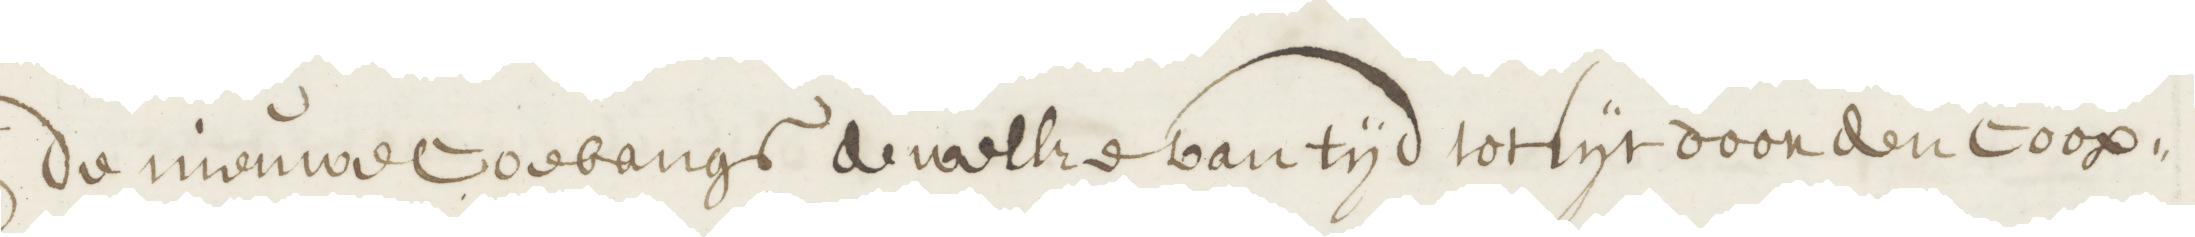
de nieuwe Coebangs dewelke van tijd tot tijt door den coop„
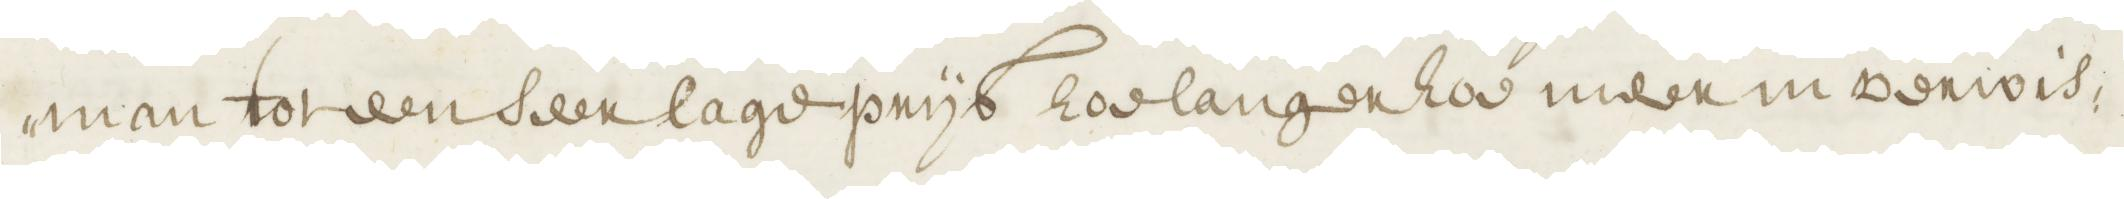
„man tot een seer lage prijs hoelanger hoe meer in verwis„
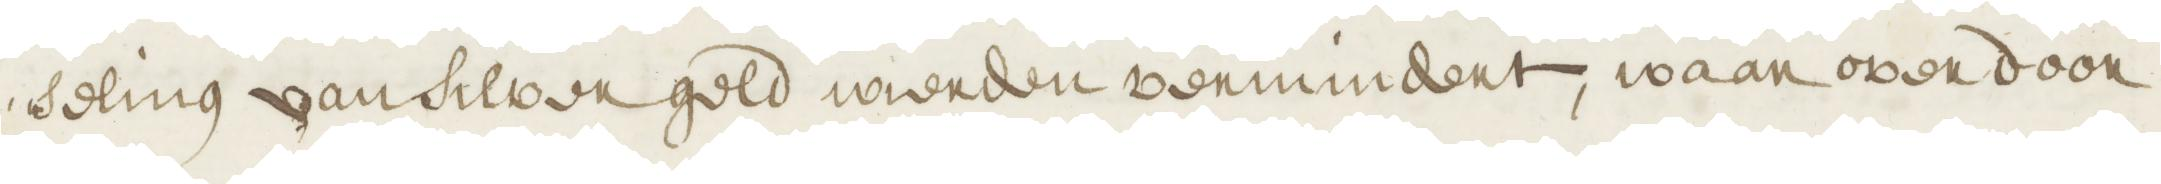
„seling van silver geld wierden vermindert, waar over door
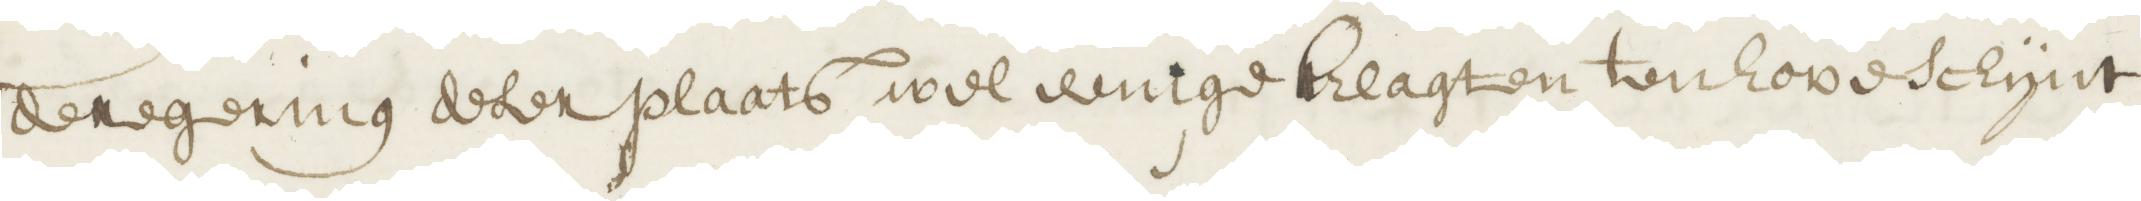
de regering deser plaats wel eenige klagten ten hove schijnt
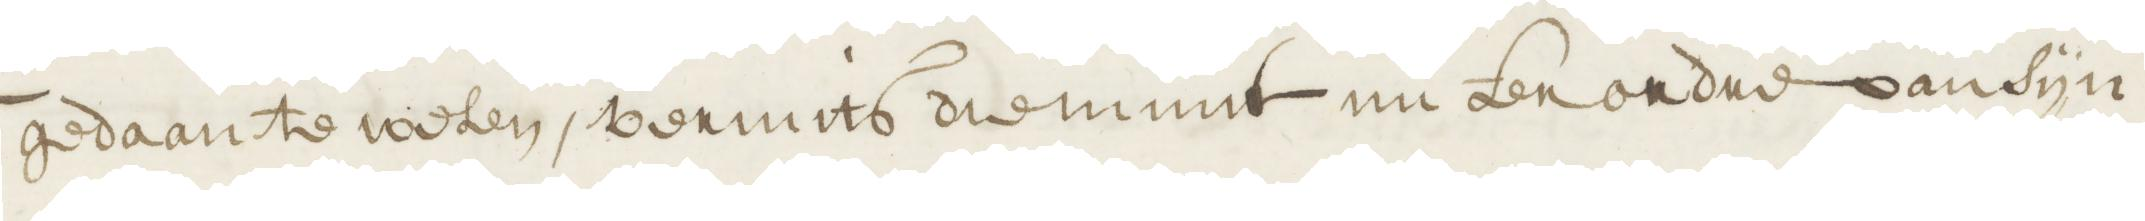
gedaan te wesen, vermits die munt nu ter ordre van sijn
